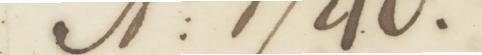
A:o 1740.
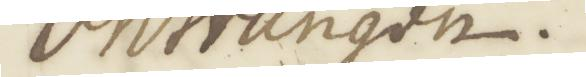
Ontvangen.
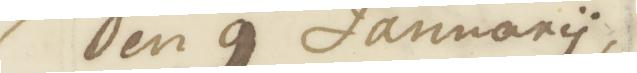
den 9' Ianuarij
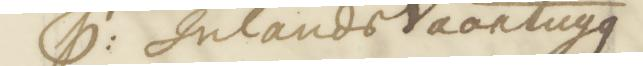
p:r Inlands Vaartuijg
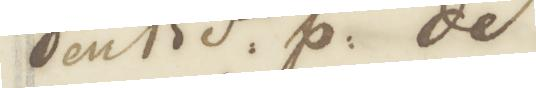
den 15 d:o p:r de
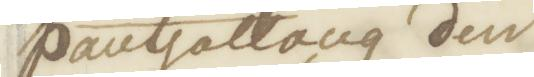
pantjallang den
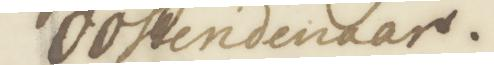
Oostendenaar.
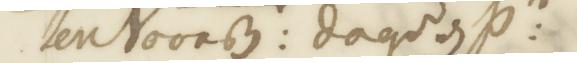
ten voorsz: dage en p:r
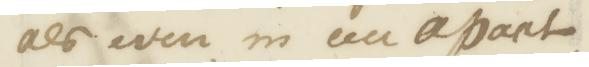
als even in een apart
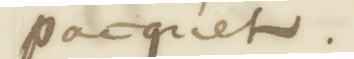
pacquet.
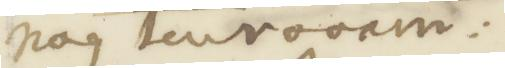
nog ten voorm:
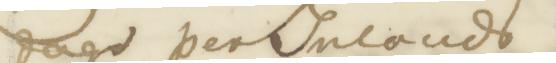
dage per Inlands
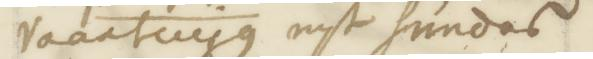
vaartuijg uyt sundas
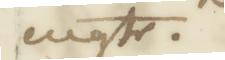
engte.
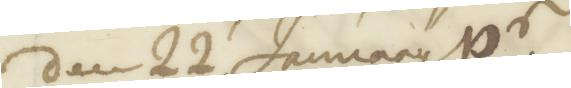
den 22:' Januarij p:r
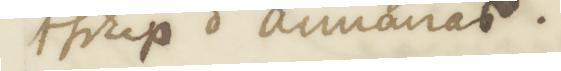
t schip d’ annanas.
